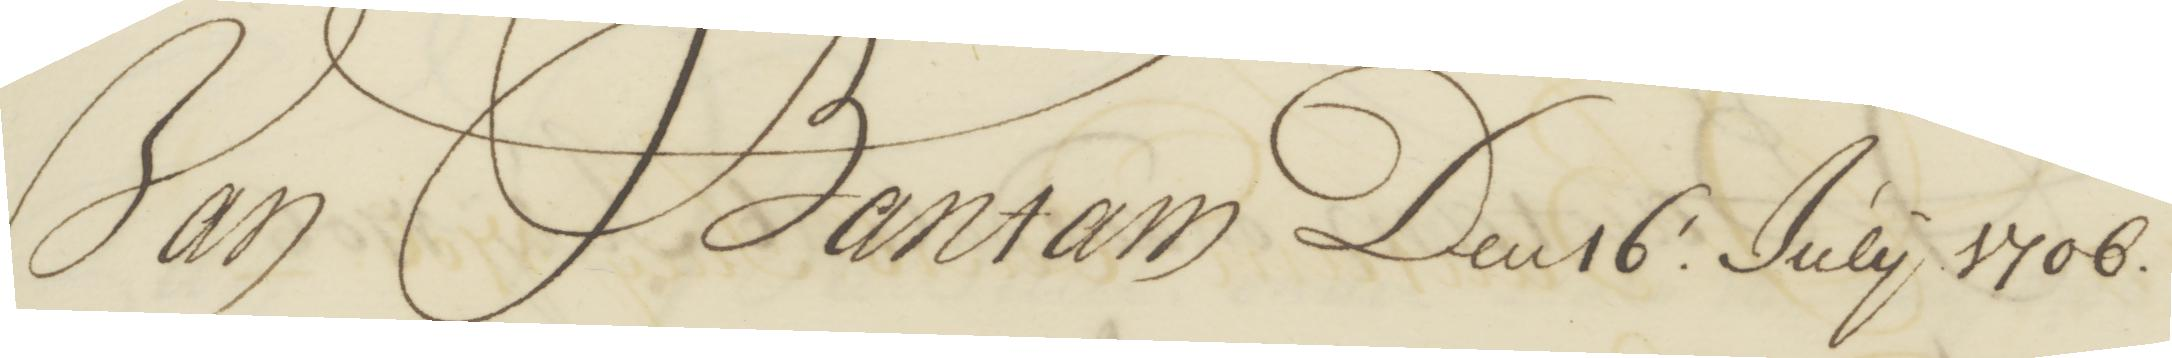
Van Bantam Den 16: Iulij 1706.
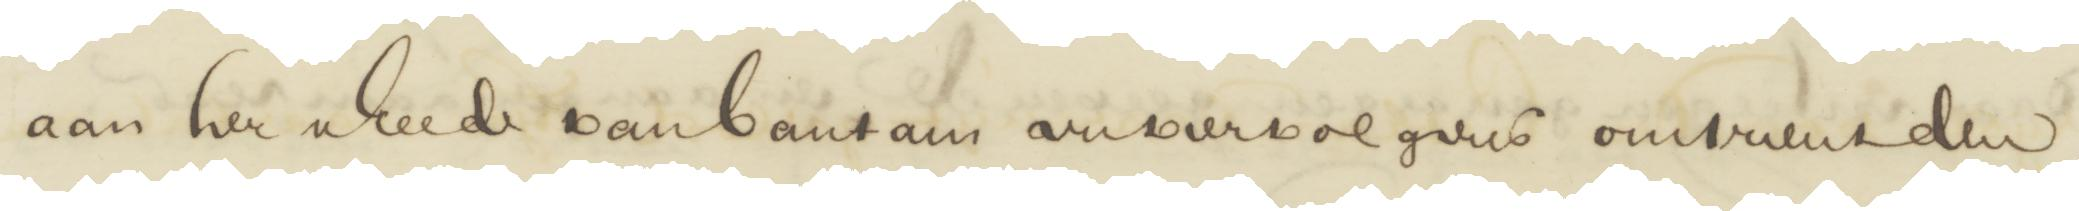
aan ter rheede van bantam en vervolgens omtrent den
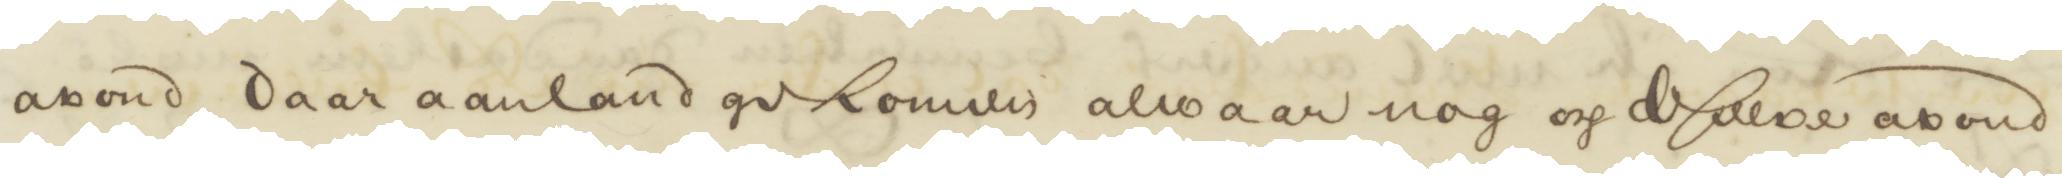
avond daar aan land gekomen alwaar nog op deselve avond
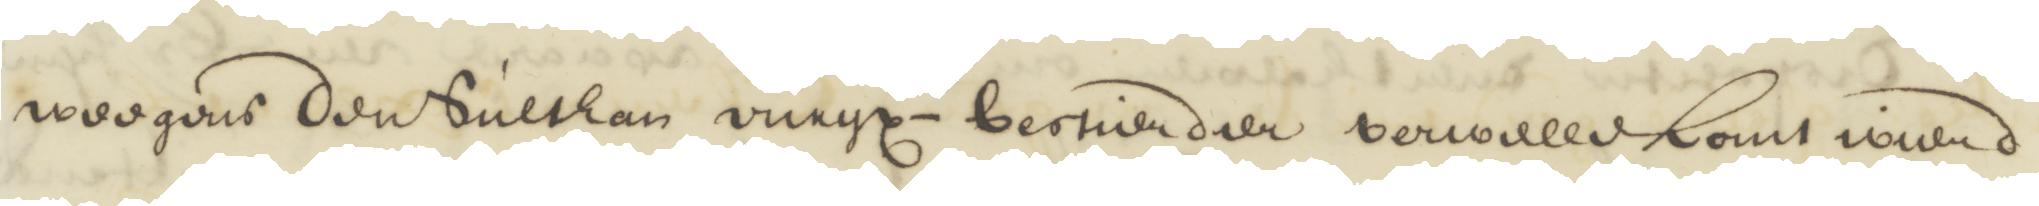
weegens den Sulthan enrijx-bestierder verwellekomt wierd
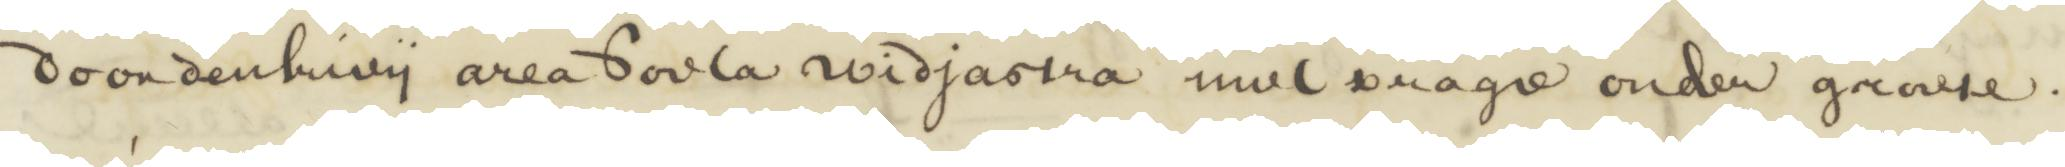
door den kieij area soeta widjastra met vrage onder groete
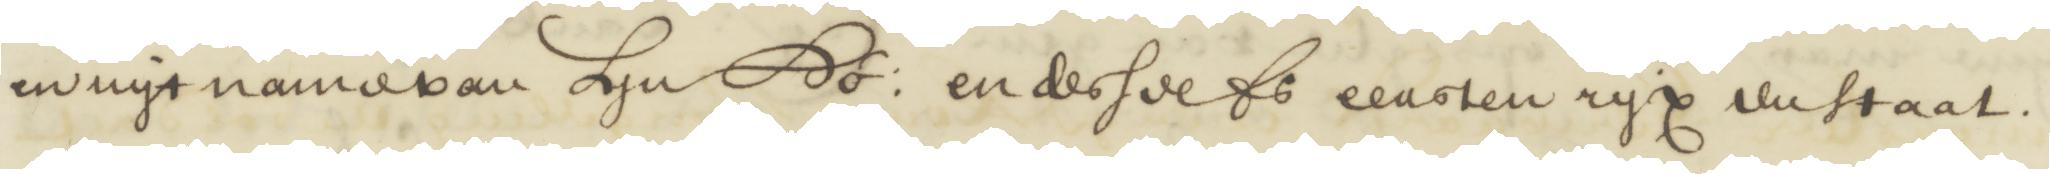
en uijt name van sijn ho: en desselfs eersten rijx en staat.
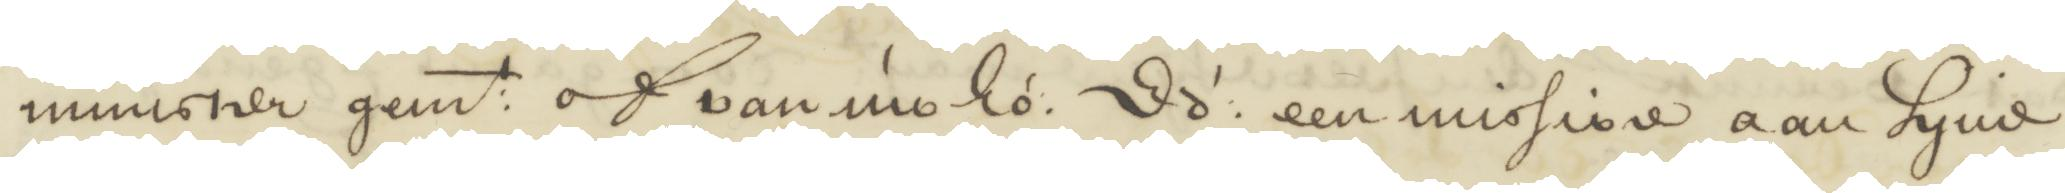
minister gem:t of van uw ho: Ed: een missive aan sijne
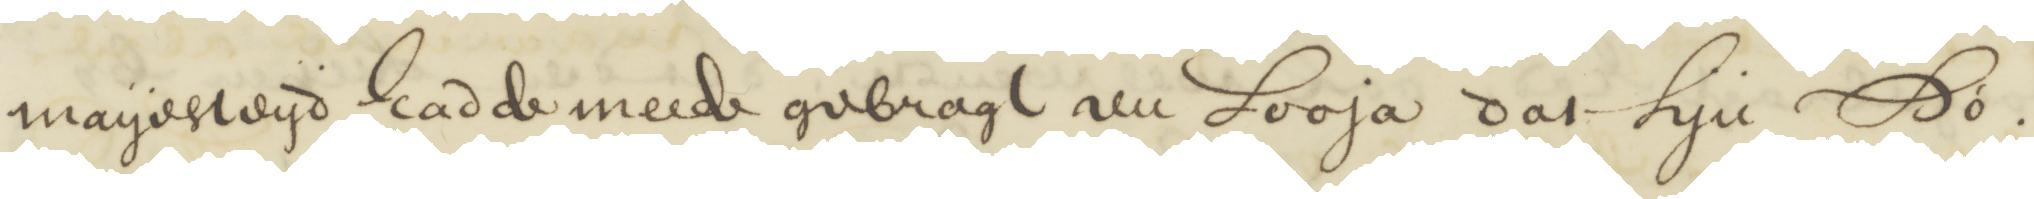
maijesteijd hadde meede gebragt en sooja dat sijn ho.
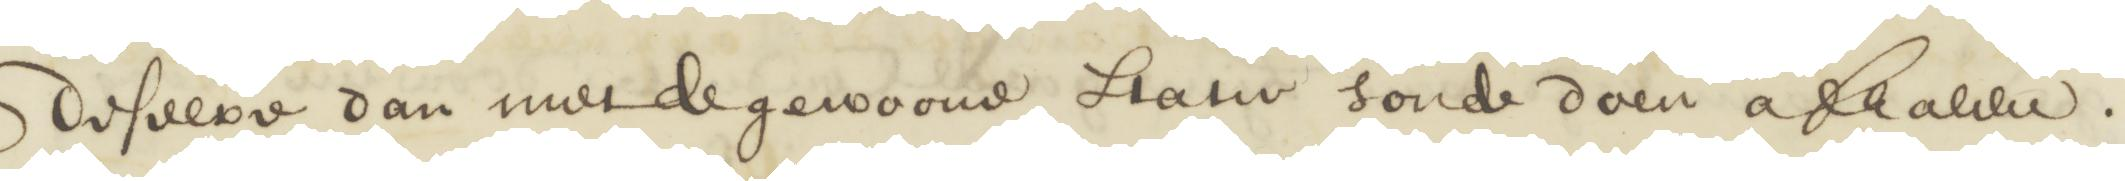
deselve dan met de gewoone statie soude doen afhalen.
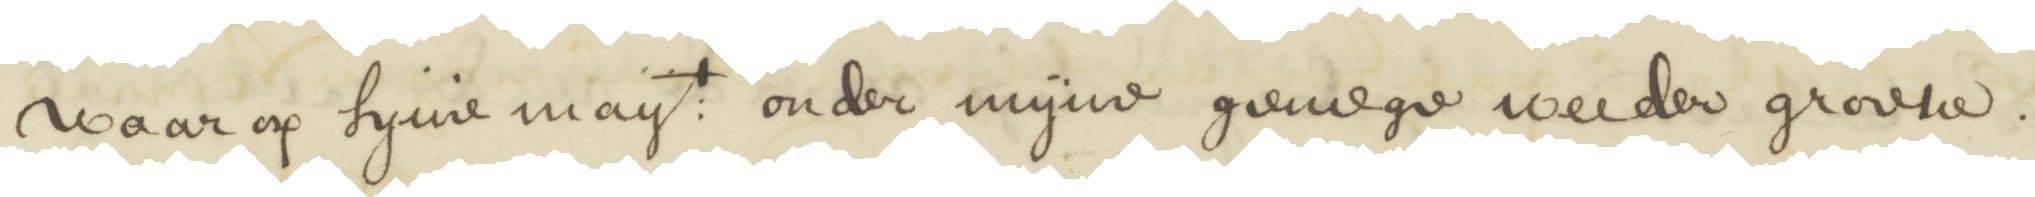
waar op sijne maij:t onder mijne genege weeder groete.
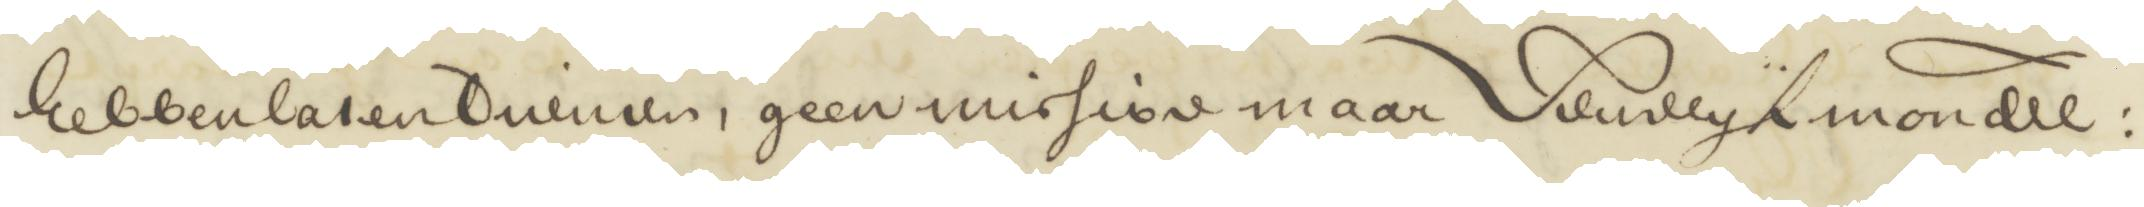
hebben laten dienen, geen missive maar Eenelijk mondel:
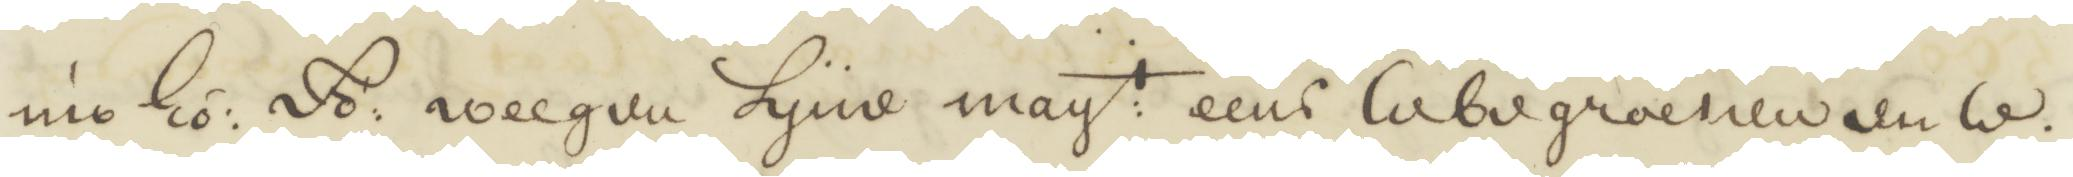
uw ho: Ed: weegen sijne maij:t eens tebegroeten en te.
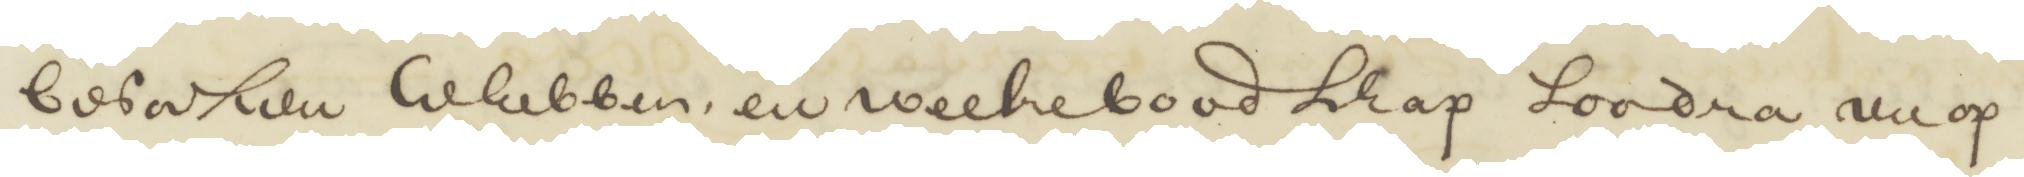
besoeken tehebben, en welke boodschap soodra en op
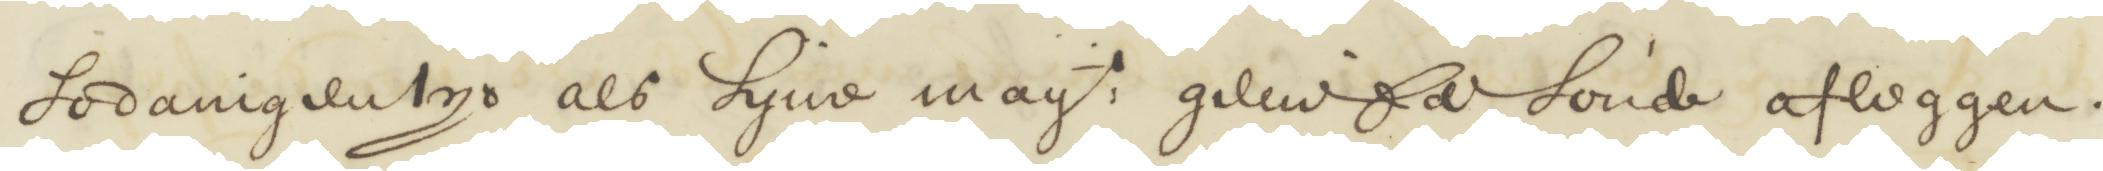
sodanigen tijd als sijne maij:t geliefde soude afleggen.
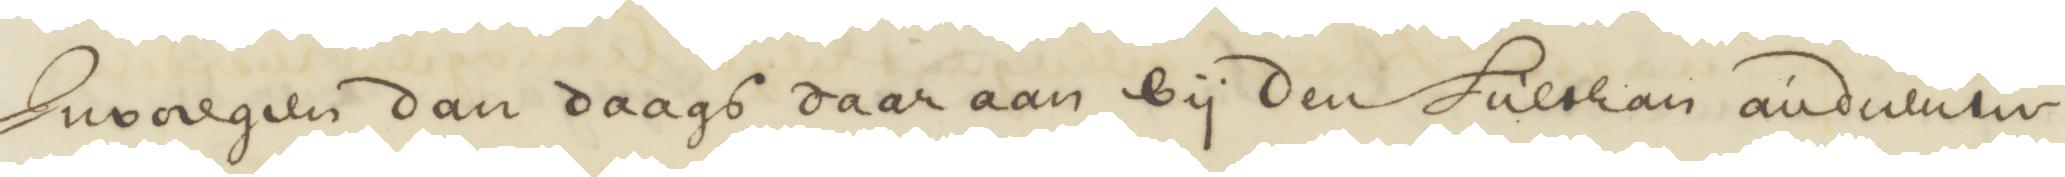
Jnvoegen dan daags daar aan bij den sulthan audientie
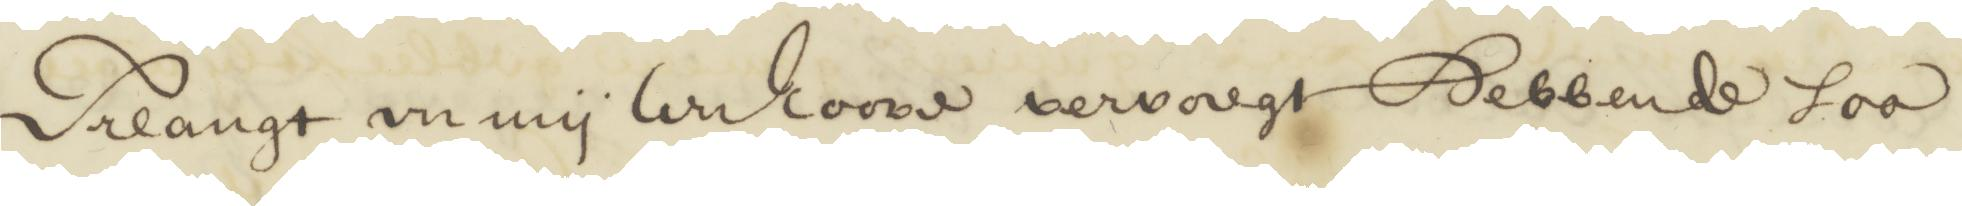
Erlangt en mij ten hoove vervoegt hebbende soo
